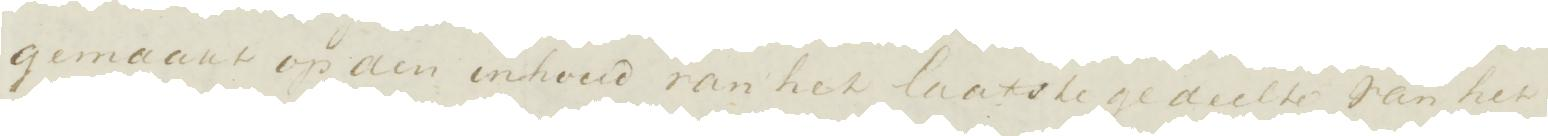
gemaakt op den inhoud van het laatste gedeelte van het
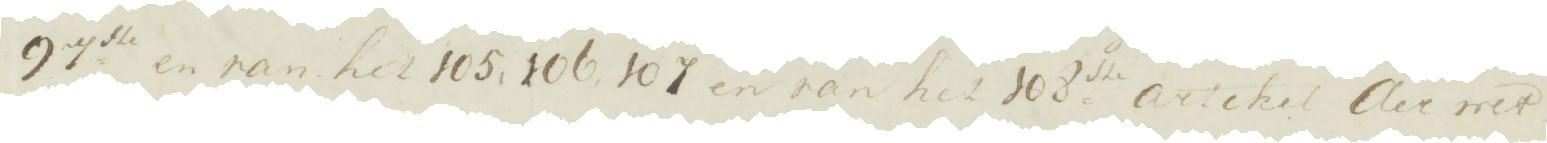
97=ste en van het 105, 106, 107 en van het 108=ste artikel der wet
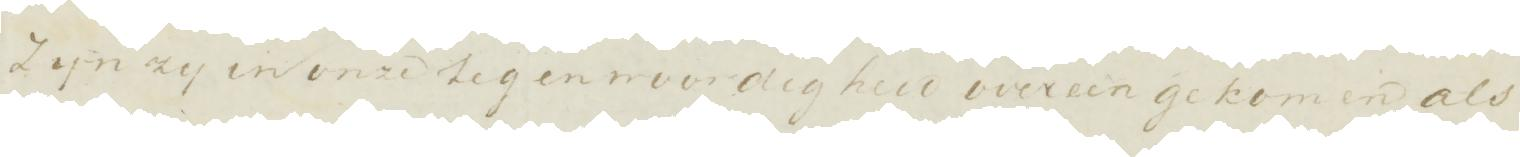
zyn zy in onze tegenwoordigheid overeen gekomen als
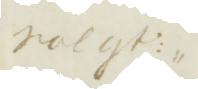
volgt: „
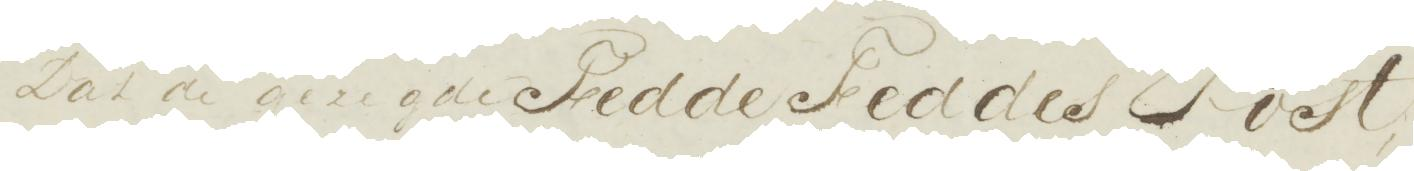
Dat de gezegde Fedde Feddes Post,
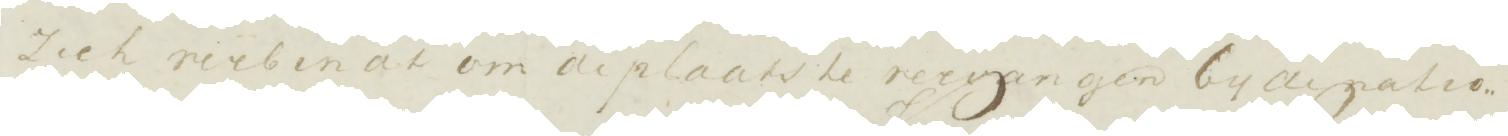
zich verbindt om de plaats te vervangen by de natio„
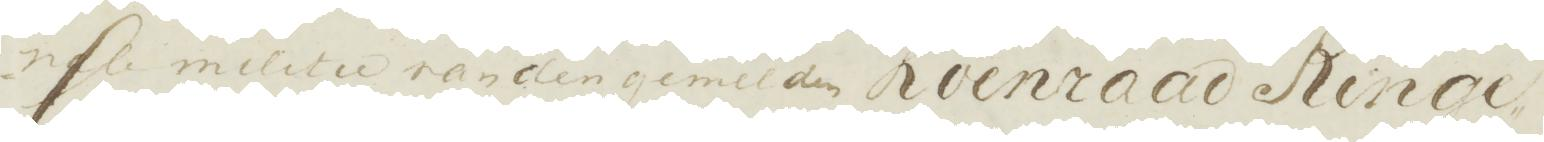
=nale militie van den gemelden Koenraad Ringe„
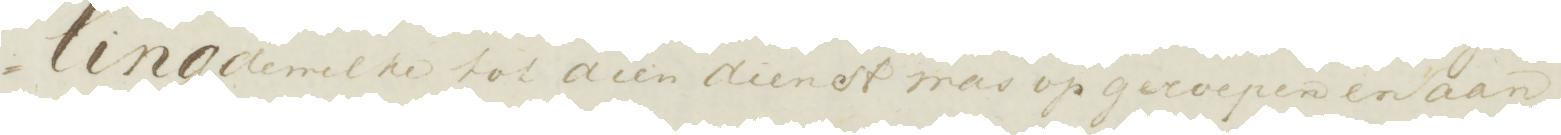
=ling, dewelke tot dien dienst was op geroepen en aan
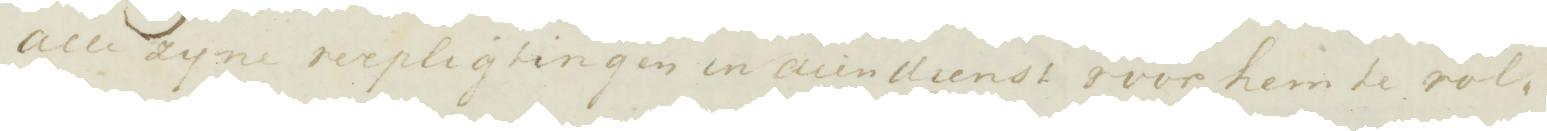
alle zyne verpligtingen in dien dienst voor hem te vol„
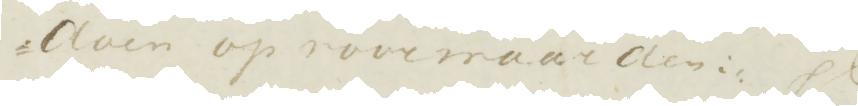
=doen op voorwaarden:,
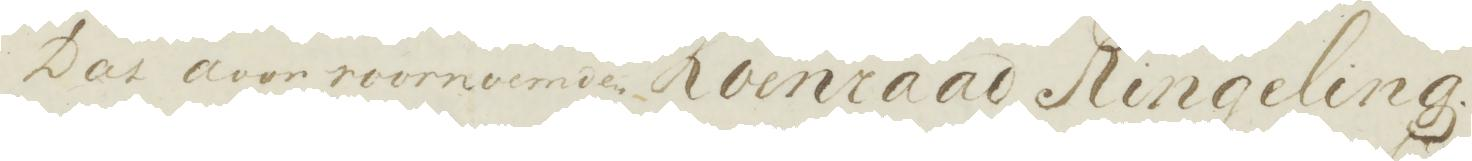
Dat door voornoemden Koenraad Ringeling.
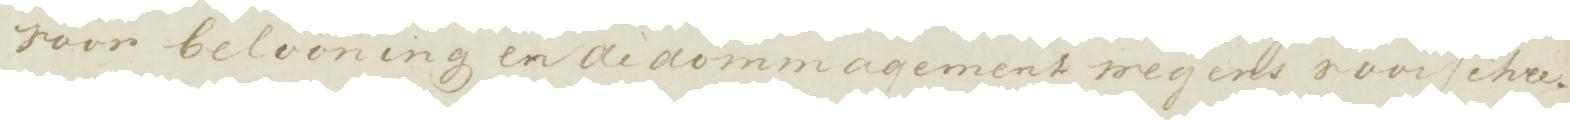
voor belooning en de dommagement wegens voorschre„
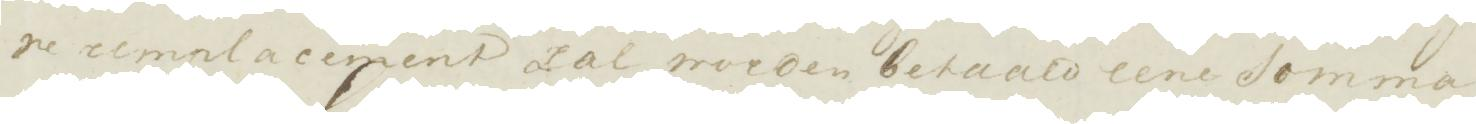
=ve remplacement zal worden betaald eene somma
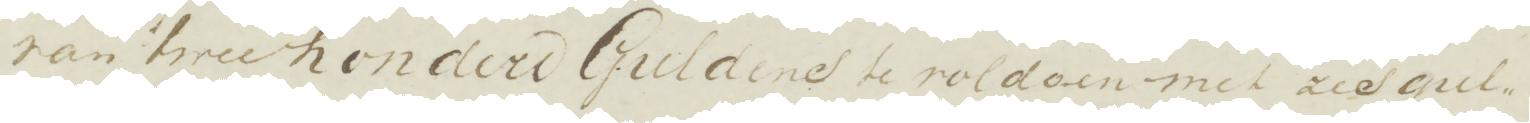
van twee honderd Guldens te voldoen met zes gul„
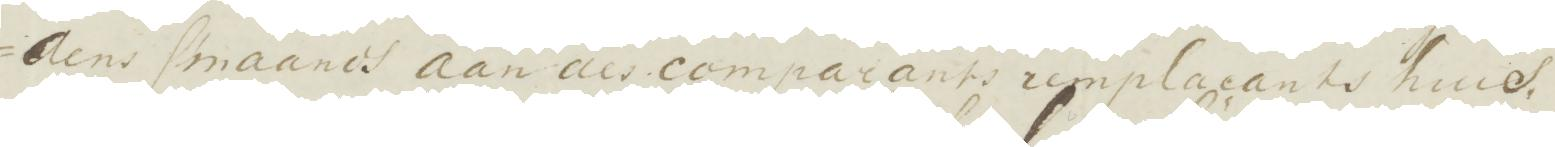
=dens s'maands aan des comparant remplaçants huis„
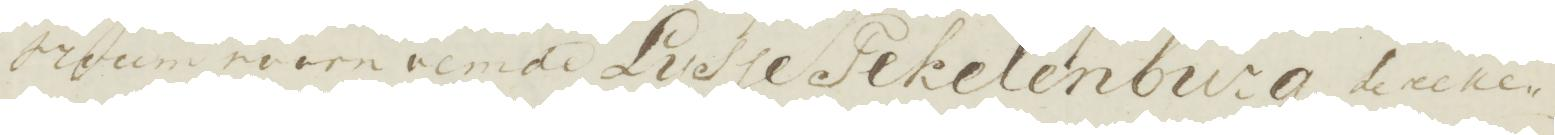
vrouw voornoemde Lysje Tekelenburg, te reke„
